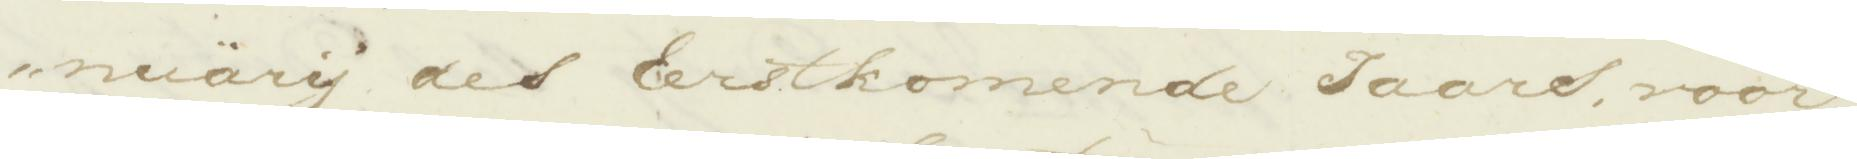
„nuarij des Eerstkomende Iaars voor
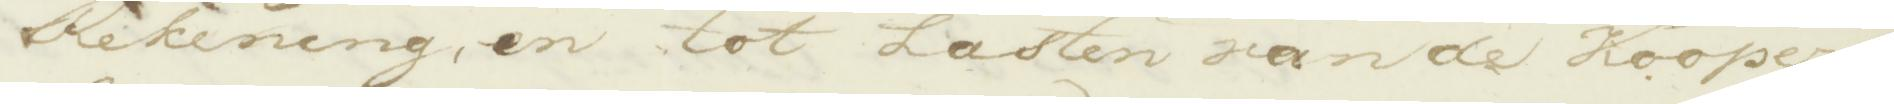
Rekening, en tot Lasten van de Koopers
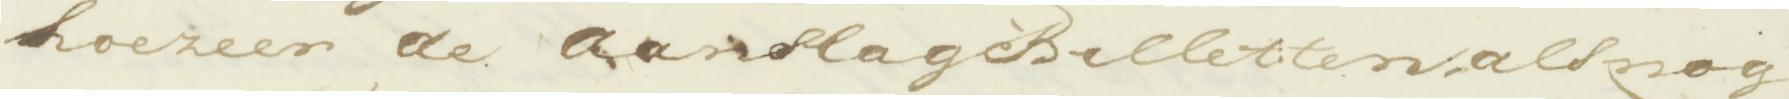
hoezeer de aanslag Billetten, als nog
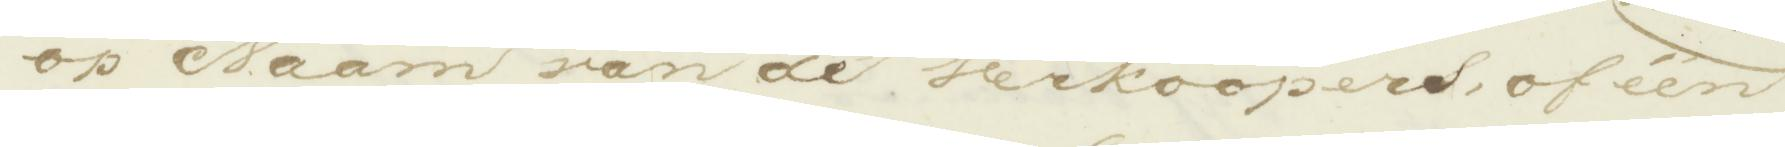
op Naam van de verkoopers, of één
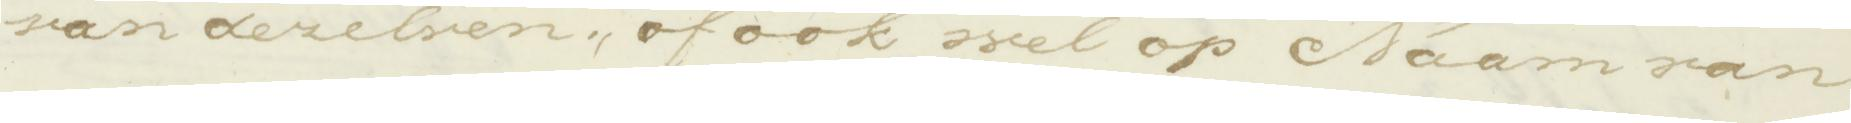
van dezelven„ of ook wel op Naam van
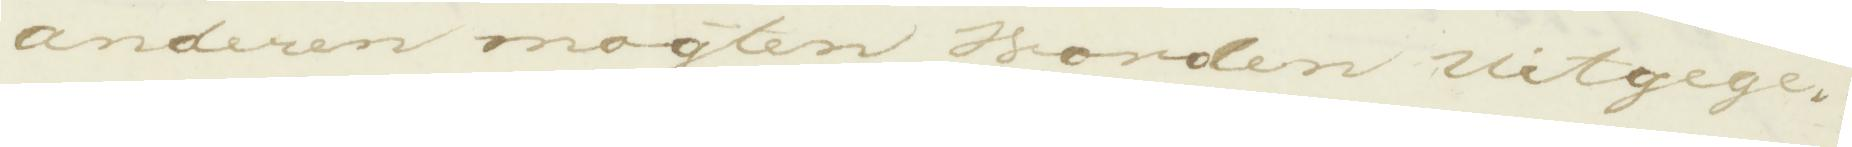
anderen mogten worden uitgege„
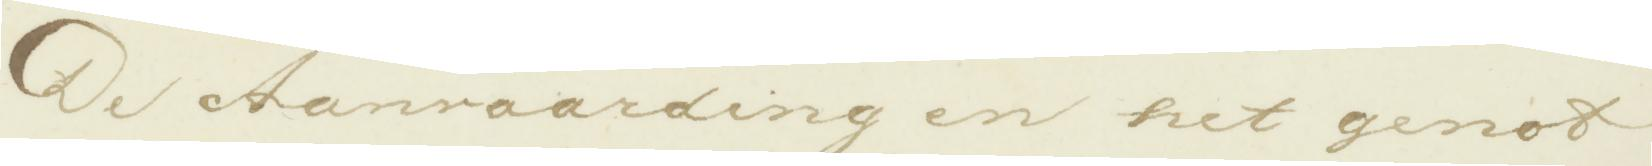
De Aanvaarding en het genot
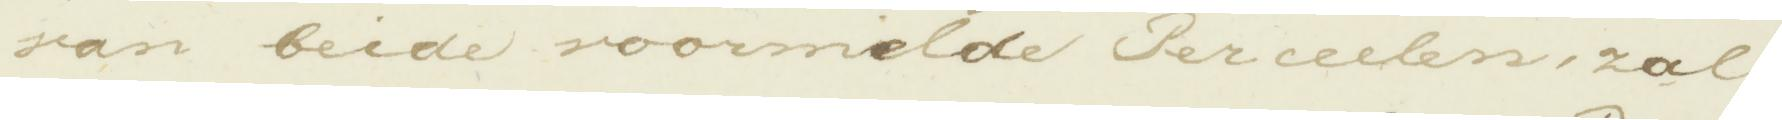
van beide voormelde Perceelen, zal
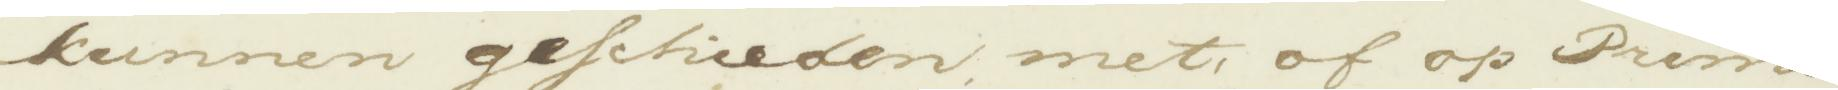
kunnen geschieden met, of op Primo
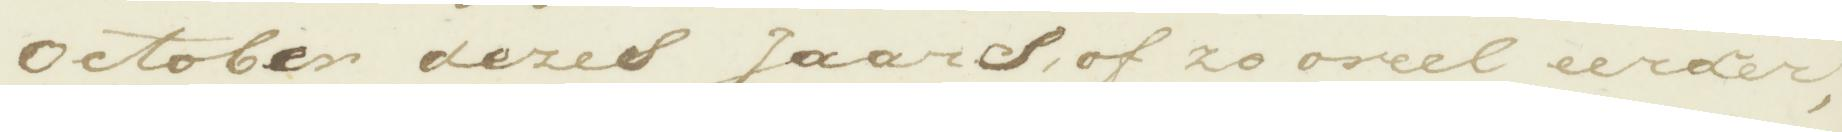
October dezes Jaars, of zo oveel eerder,
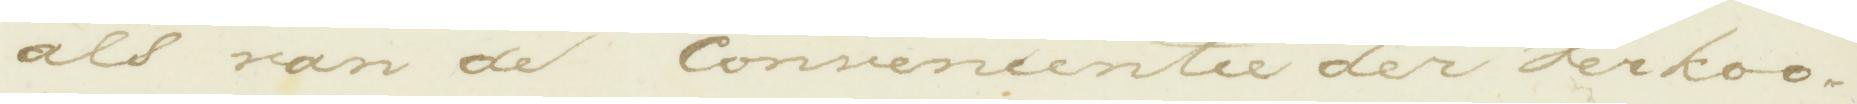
als van de Convencentie der verkoo„
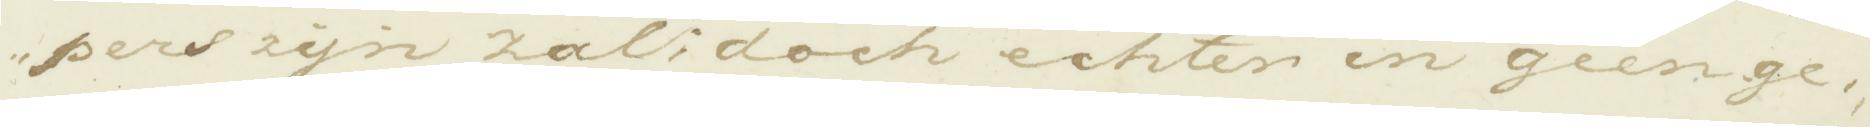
„pers zijn zal, doch echter in geen ge„
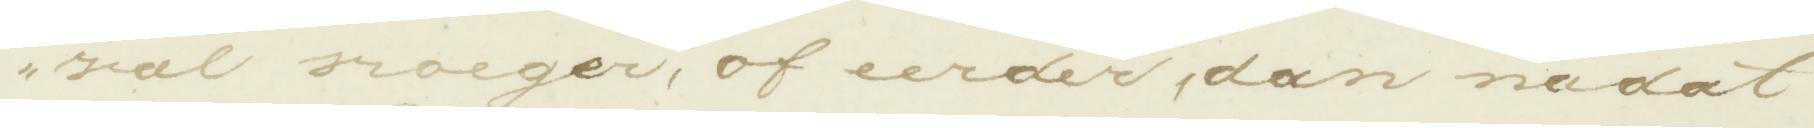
„vel vroeger, of eerder, dan nadat
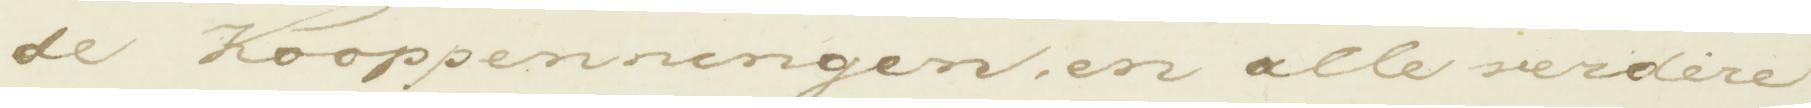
de Kooppenningen, en alle verdere
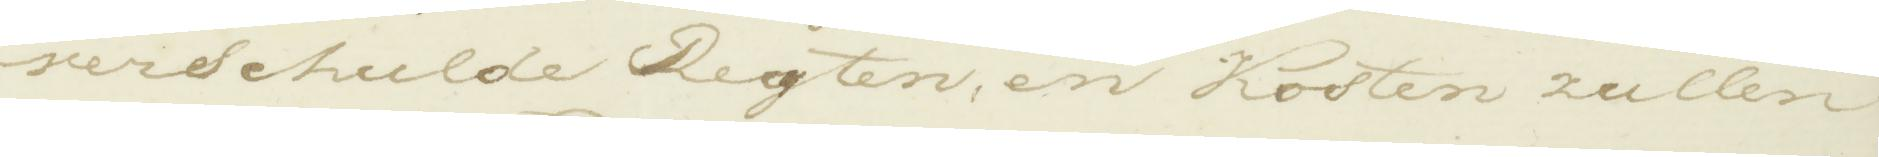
verschulde Regten, en Kosten zullen
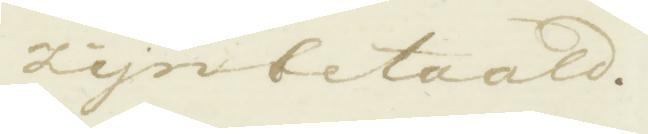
zijn betaald.
